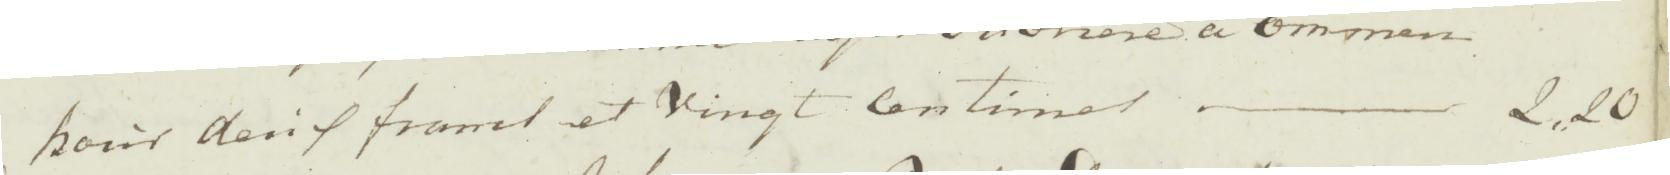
pour deux francs et Vingt Centimes — 2„20
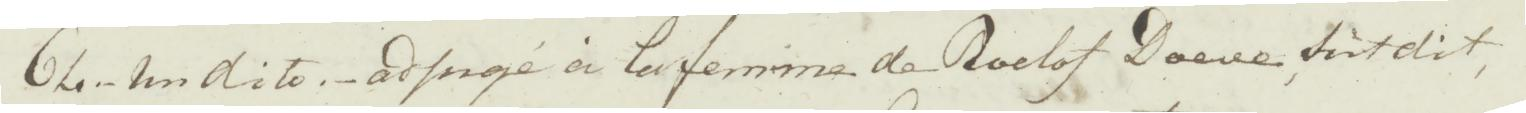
64.- un dito. -adjugé à la femme de Roelof Doeve Sus dit,
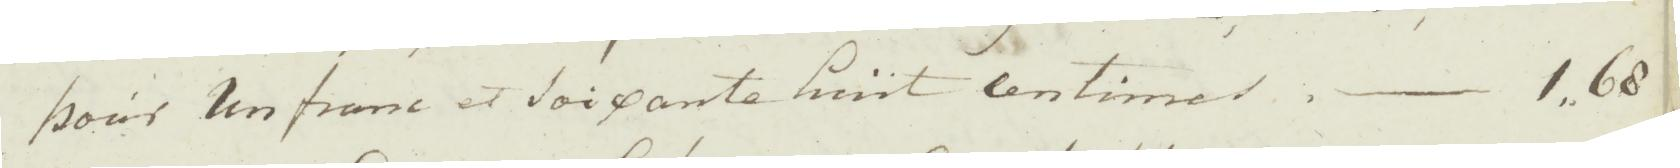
pour un franc et soixante huit Centimes — 1„68
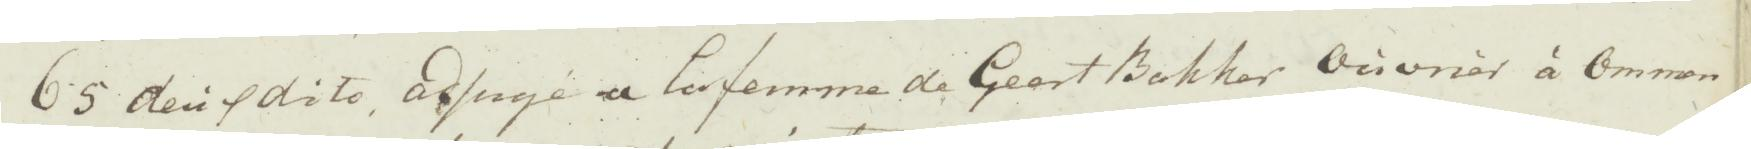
65 deux dito, adjugé a la femme de Geert Bakker Ouvrier à Ommen
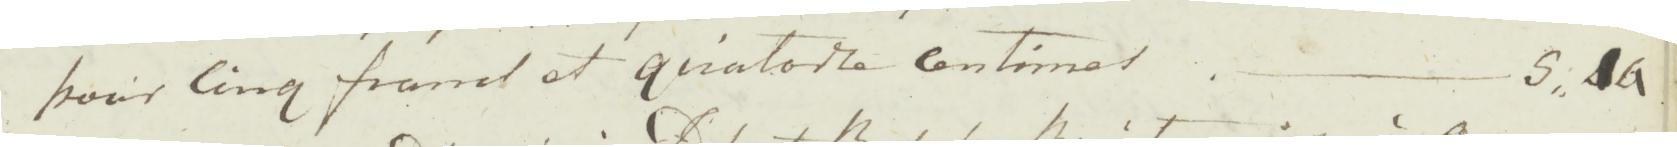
pour cinq francs et quatorze Centimes — 5„40
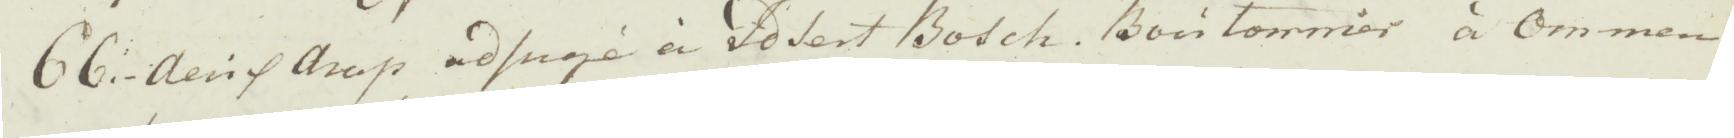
66.- deux drap adjugé à Edsert Bosch. Boutonnier à Ommen
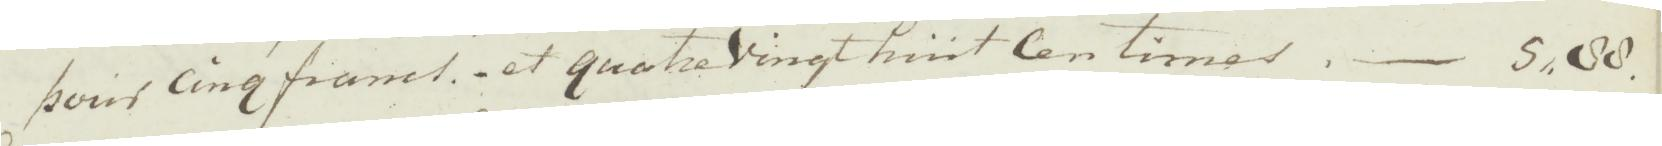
pour cinq francs. - et quatre Vingt huit Centimes, — 5„88.
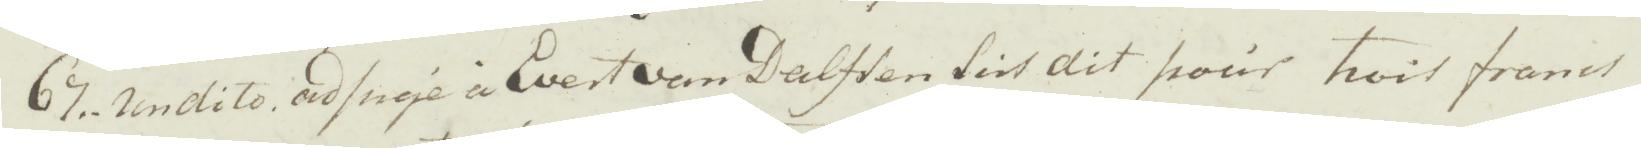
67. un dito, adjugé à Evert van Dalfsen Sus dit pour trois francs
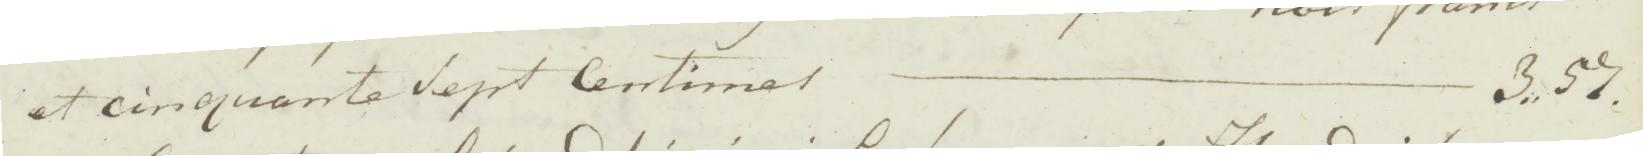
et cinquante Sept Centimes — 3„57.
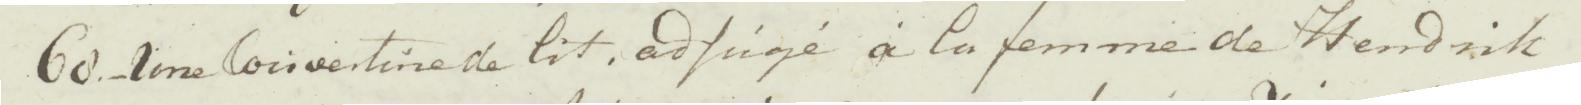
68. Une Couverture de lit, adjugé à la femme de Hendrik
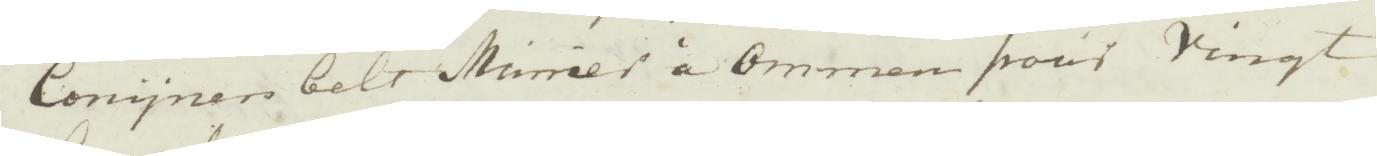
Conijnenbelt Murrier à Ommen pour Vingt
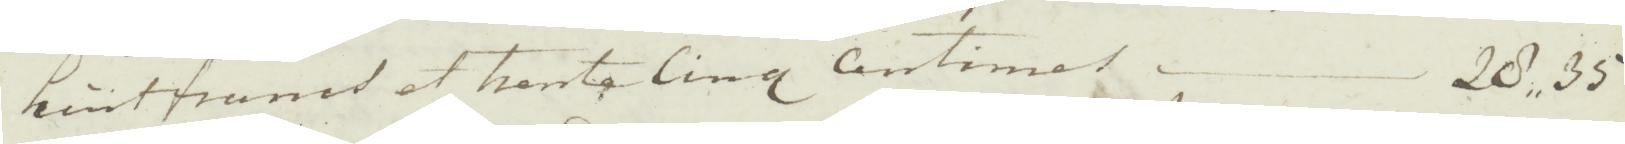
huit francs et trente Cinq Centimets— 28„35
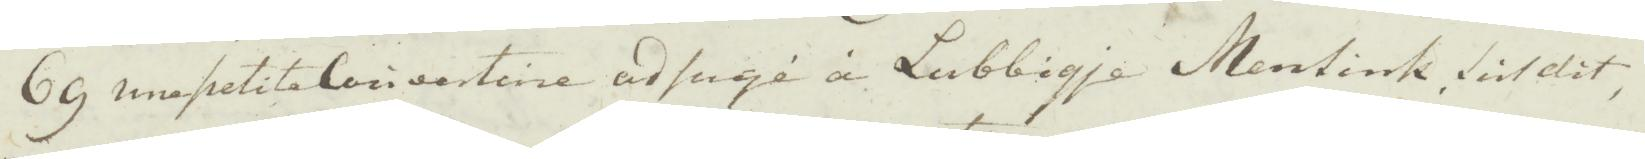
69 une petite Couverture adjugé à Lubbigje Mensink, sus dit,
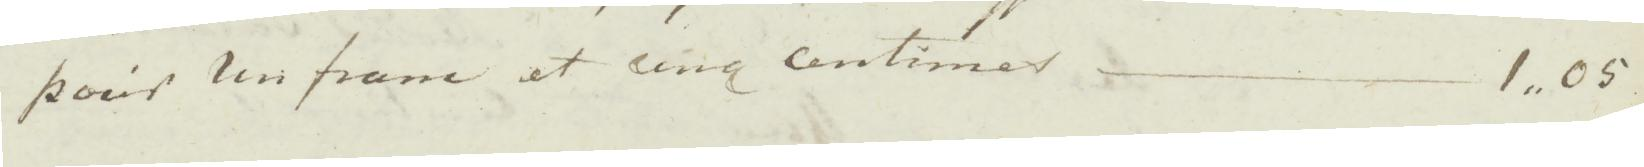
pour un franc et cinq Centimes — 1„05.
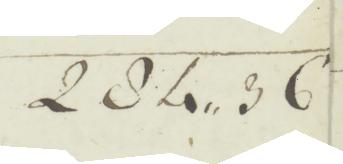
284„36
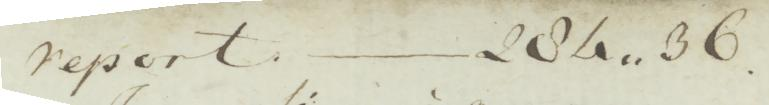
report: — 284„36.
